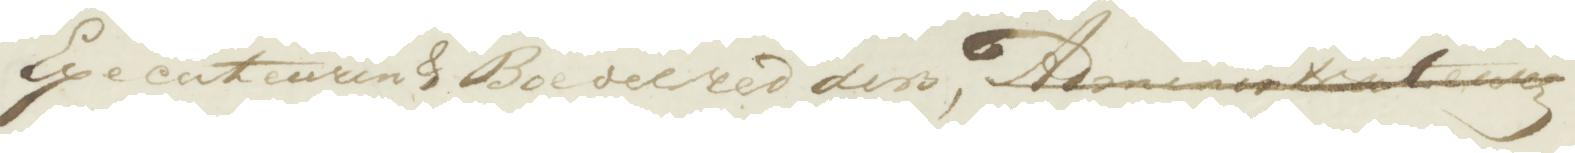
Executeuren & Boedelredders, Admininstrateuren
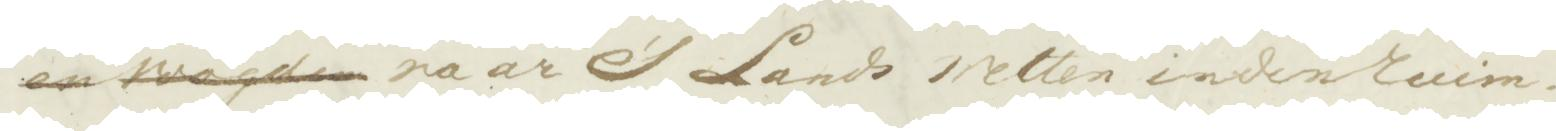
en wagten naar 's Lands wetten in den ruim
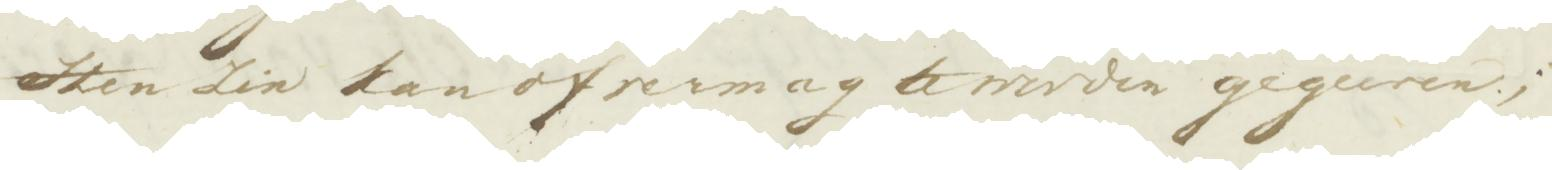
sten zin kan of vermag te werden gegeeven;
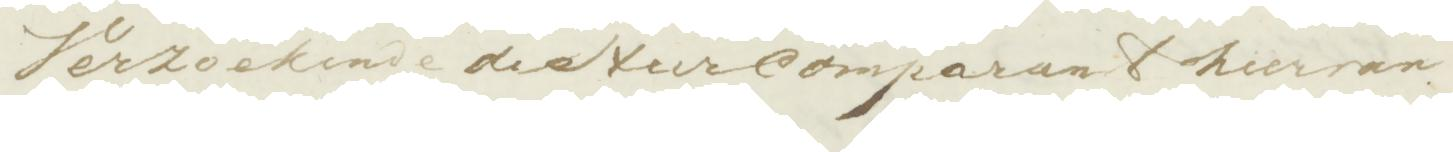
Verzoekende de Heer comparant hier van
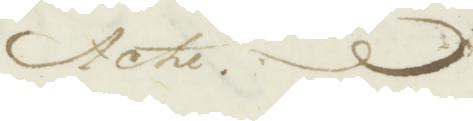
Acht.
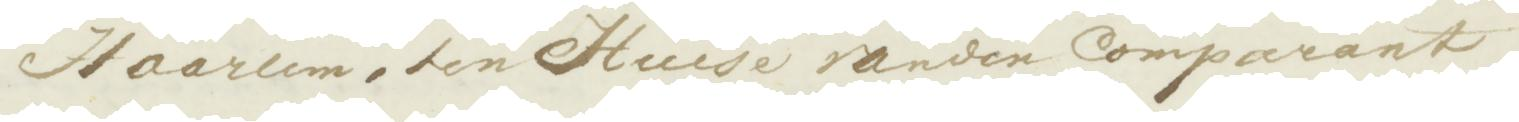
Haarlem, ten Huise van den Comparant
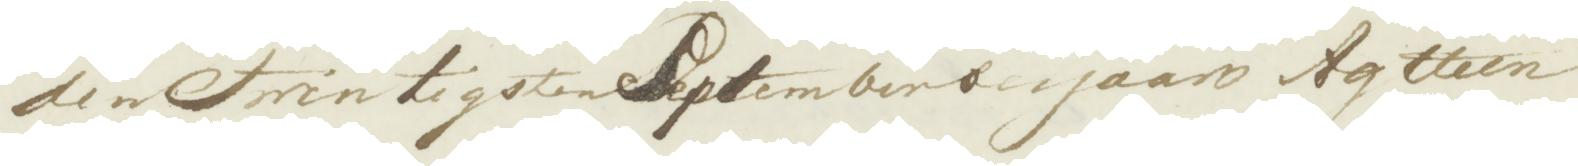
den Twintigsten September des jaar Agttien
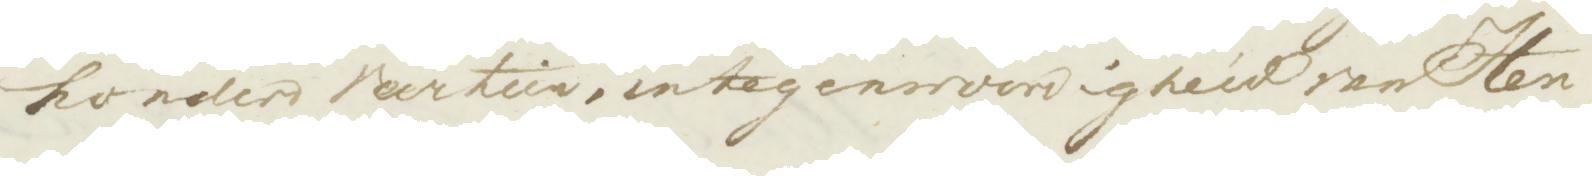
honderd veertien, in tegenwoordigheid van Hen
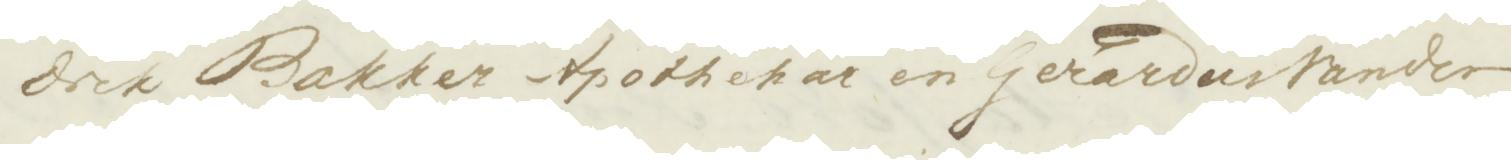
drik Bakker Apothekar en Gerardus van der
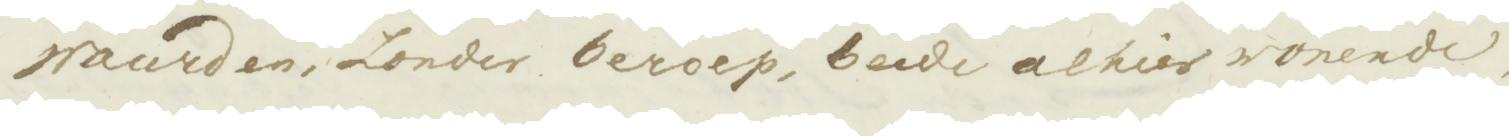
waarden, zonder beroep, beide alhier wonende,
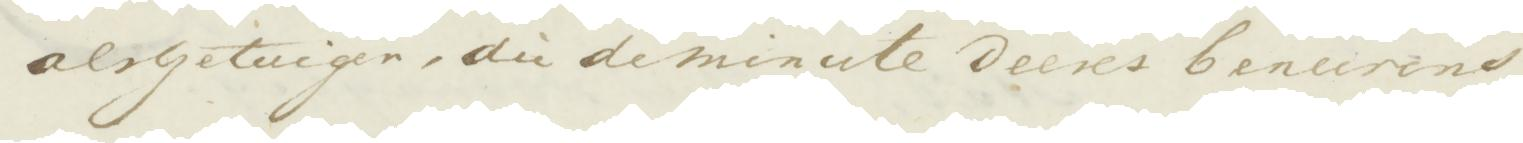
als Getuigen, die de minute deeses beneevens
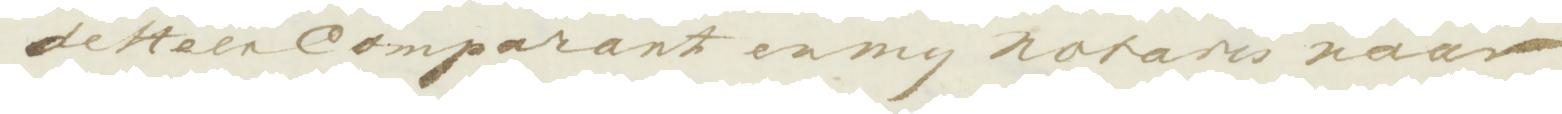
de Heer Comparant en mij notaris naar
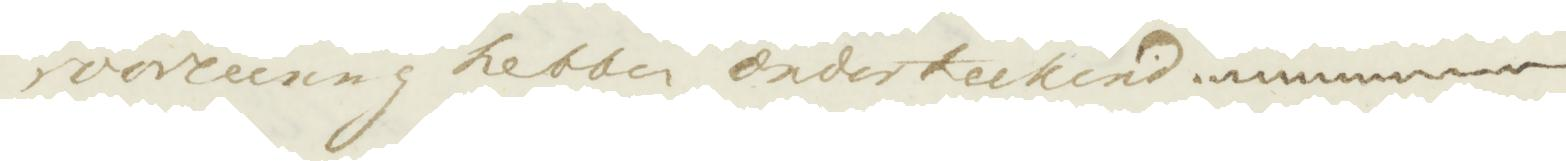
voorleesing hebben onderteekend. —
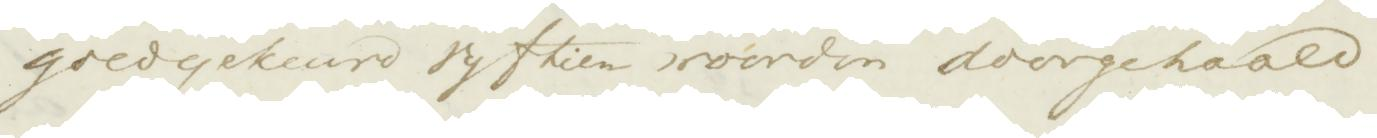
goedgekeurd vyftien woorden doorgehaald
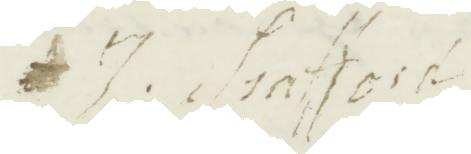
J. Staffort
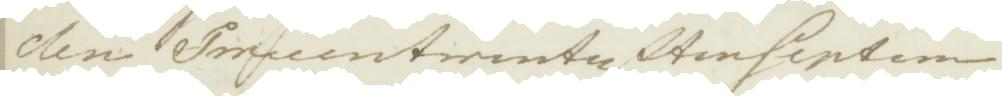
den Tweeentwintigsten Septem
